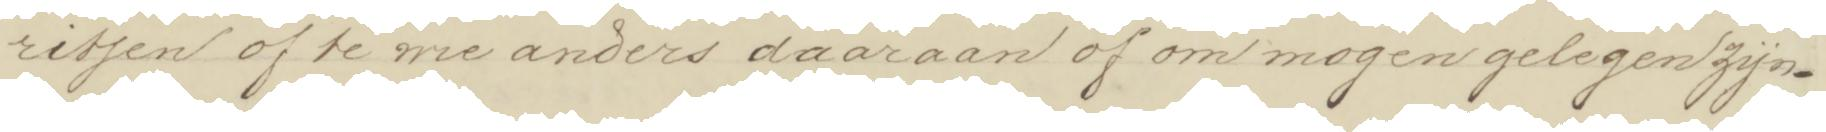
ritsen of te wie anders daar aan of om mogen gelegen zijn
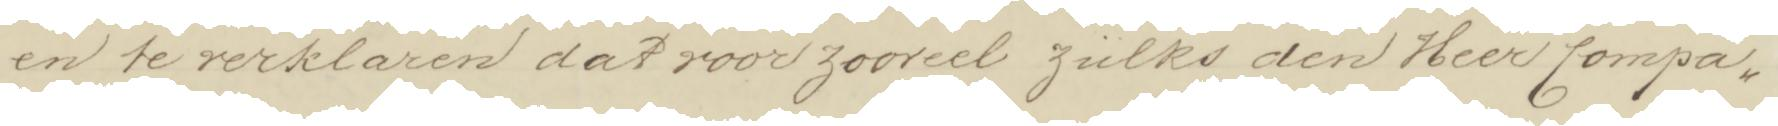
en te verklaren dat voor zooveel zulks den Heer Compa„
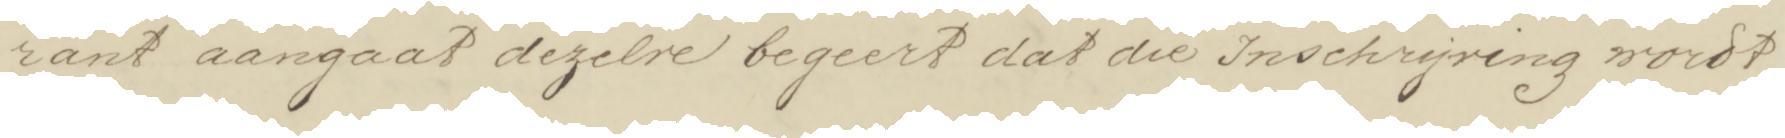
rant aangaat dezelve begeert dat die Inschrijving wordt
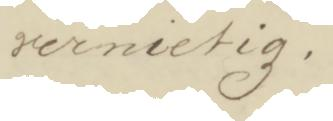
vernietig.
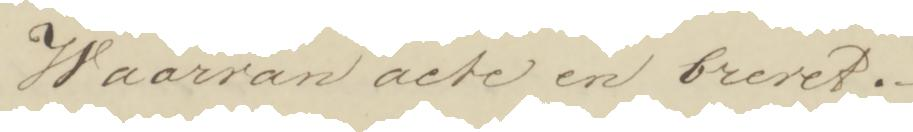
Waarvan acte en brevet.
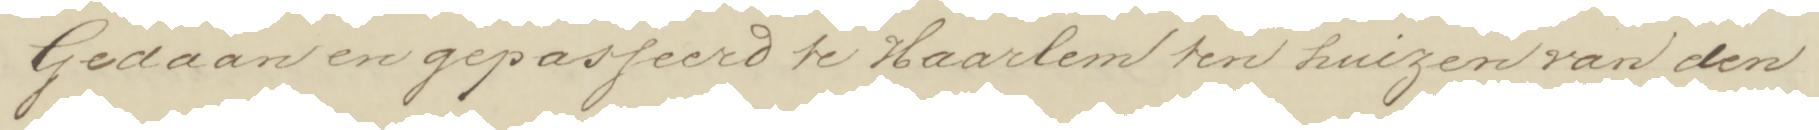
Gedaan en gepasseerd te Haarlem ten huizen van den
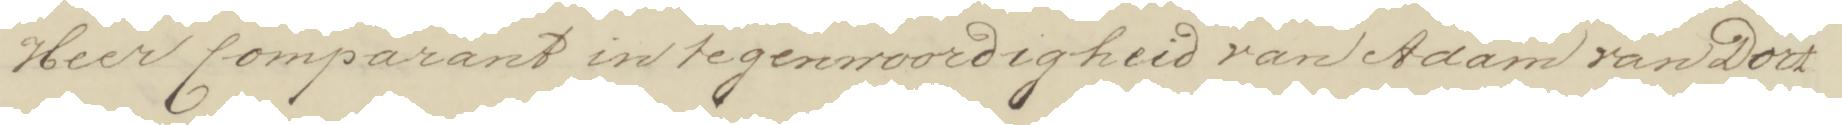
Heer Comparant in tegenwoordigheid van Adam van Dort
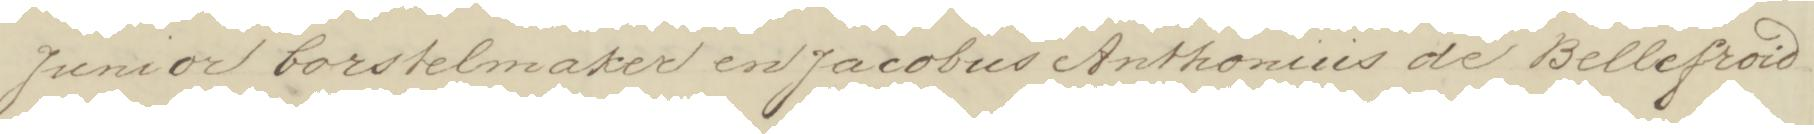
Junior borstelmaker en Jacobus Anthonius de Bellefroid
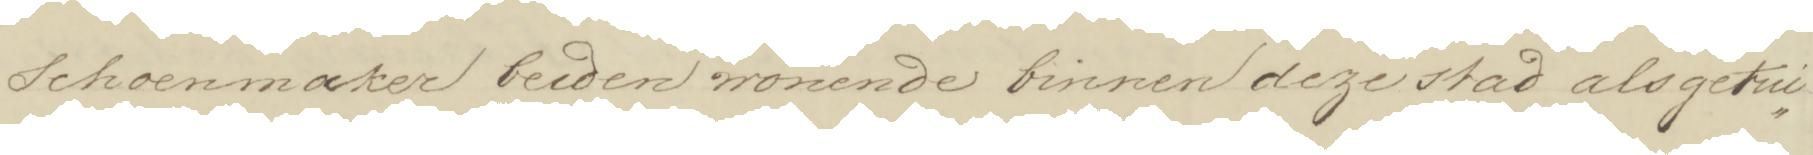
schoenmaker beiden wonende binnen deze stad als getui„
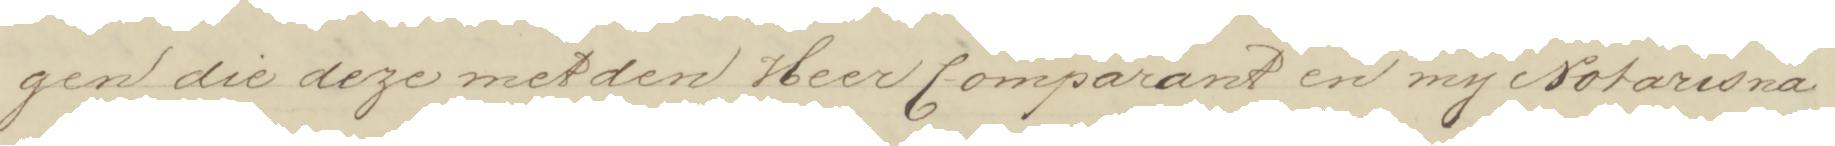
gen die deze met den Heer Comparant en my Notaris na
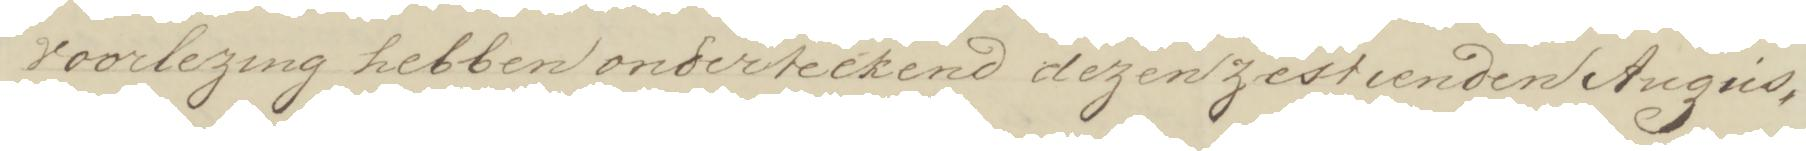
voorlezing hebben onderteekend dezen zestienden Augus,
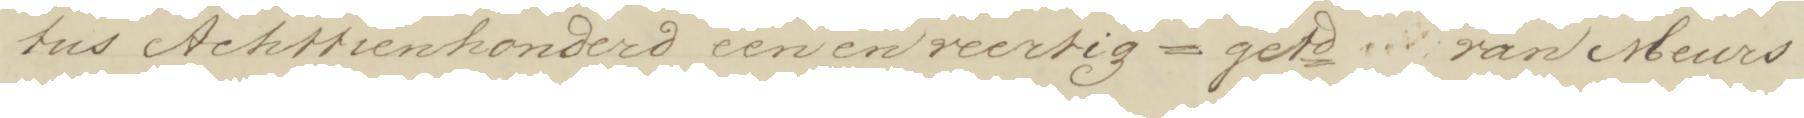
tus Achttienhonderd een en veertig = gete=d . . . : van Meurs
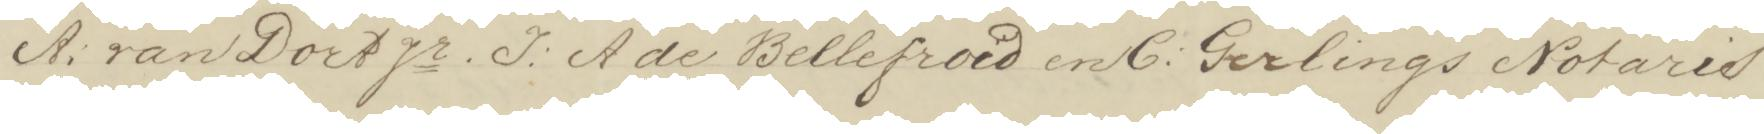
A: van Dort J=m J: A de Bellefroid en C: Gerlings Notaris
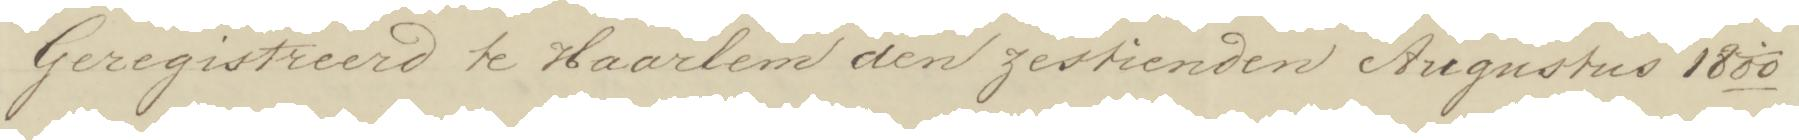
Geregistreerd te Haarlem den zestienden Augustus 1800
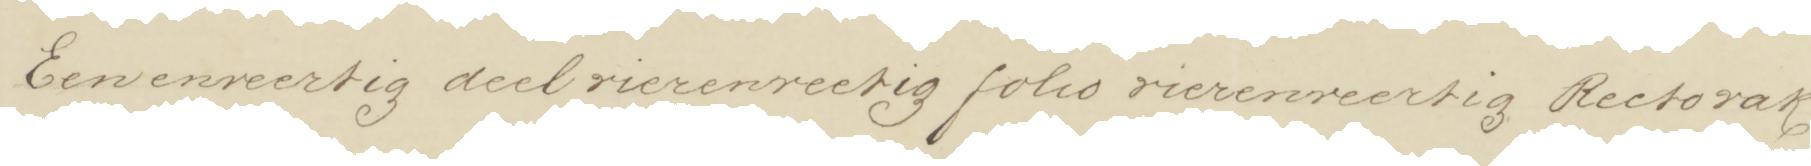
Een enveertig deel vierenveerig folio vierenveertig Recto vak
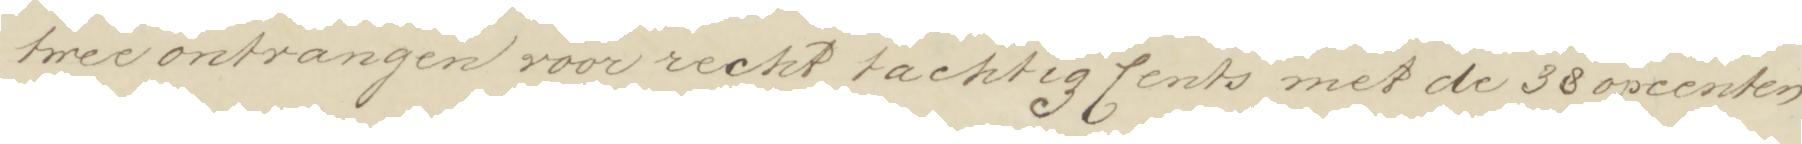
twee ontvangen voor recht tachtig Cents met de 38 opcenten
